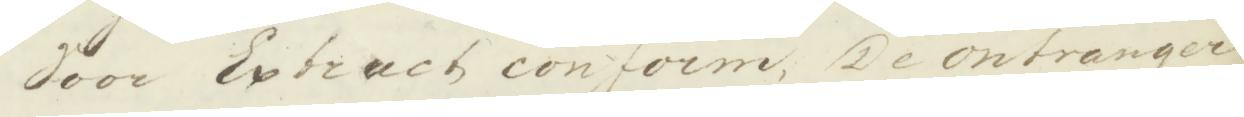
Voor Extract conform, De ontvanger
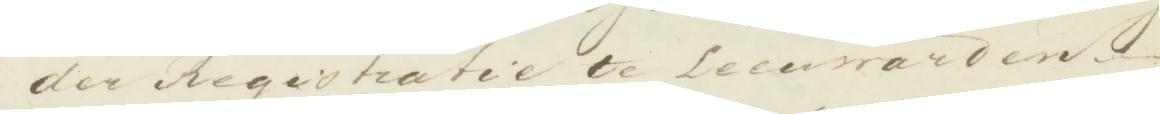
der Registratie te Leeuwarden
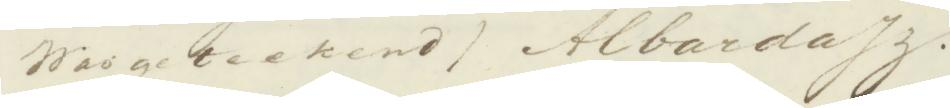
was geteekend ) Albarda Jz
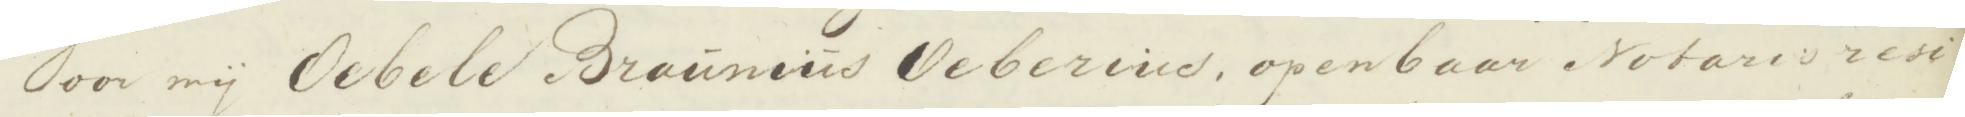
Voor mij Oebele Braunius Oeberius, openbaar Notaris resi
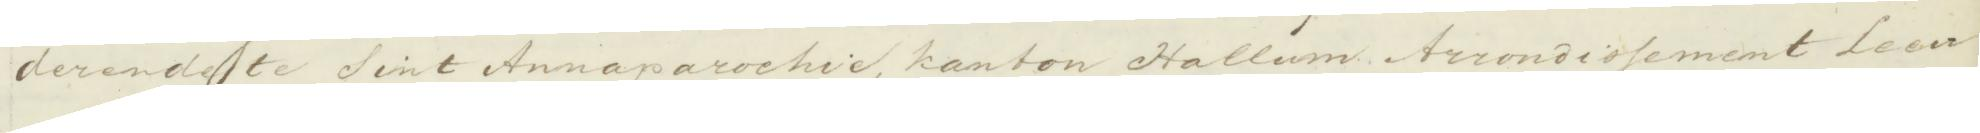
derende te Sint Annaparochie, kanton Hallum Arrondissement Leeu
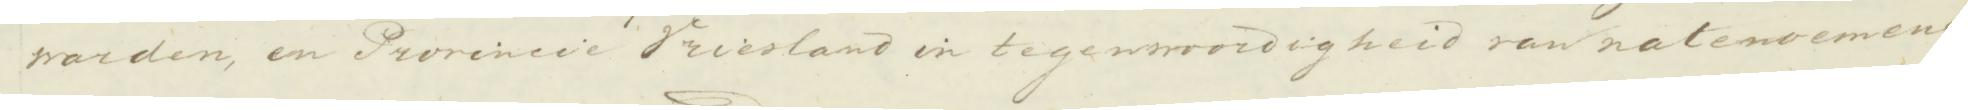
warden, en Provincie Vriesland in tegenwoordigheid van natenoemene
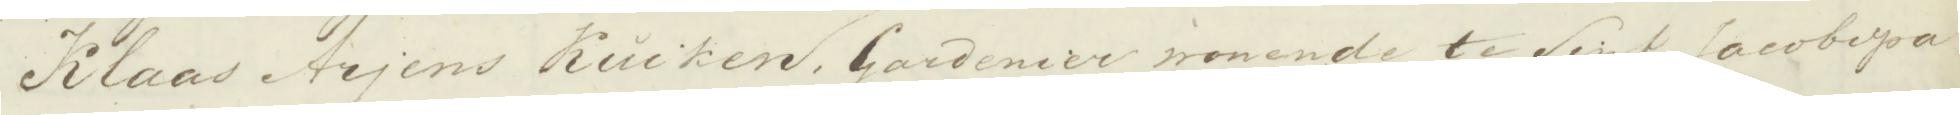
Klaas Arjens Kuiken, Gardenier wonende te Sint Jacobipa
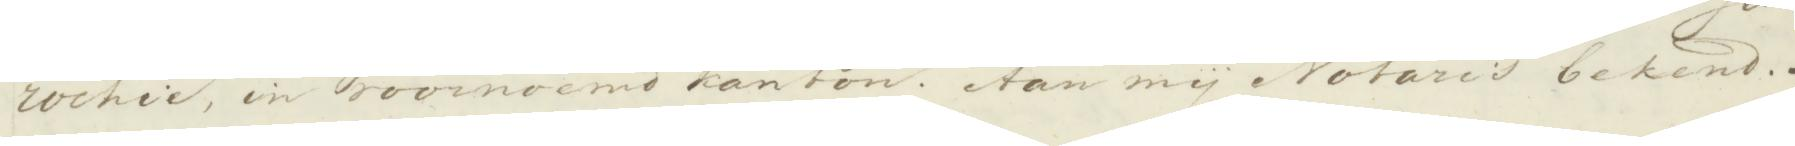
rochie, in voornoemd kanton. Aan mij Notaris bekend.
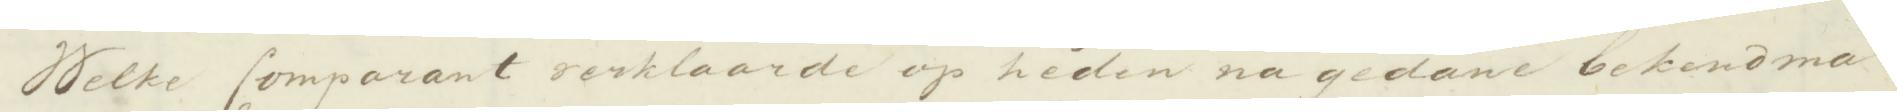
Welke Comparant verklaarde op heden na gedane bekendma
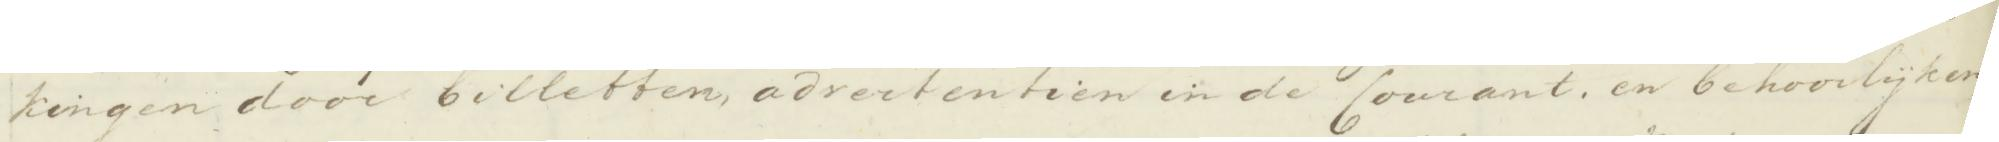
kingen door billetten, advertentien in de Courant, en behoorlijken
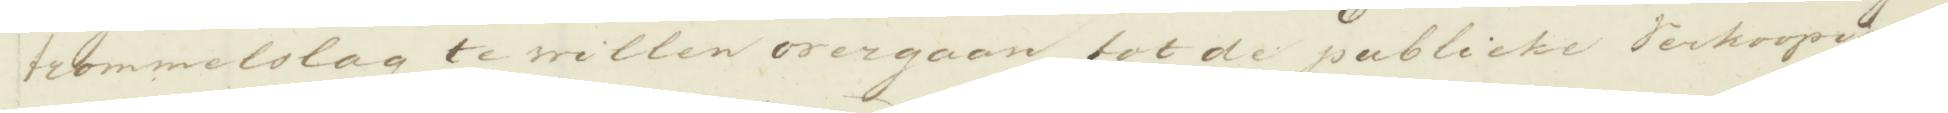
trommelslag te willen overgaan tot de publieke verkooping
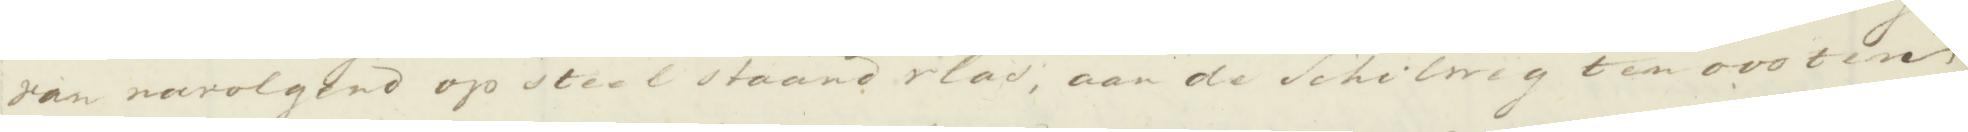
van navolgend op steel staand vlas, aan de Schilweg ten oosten
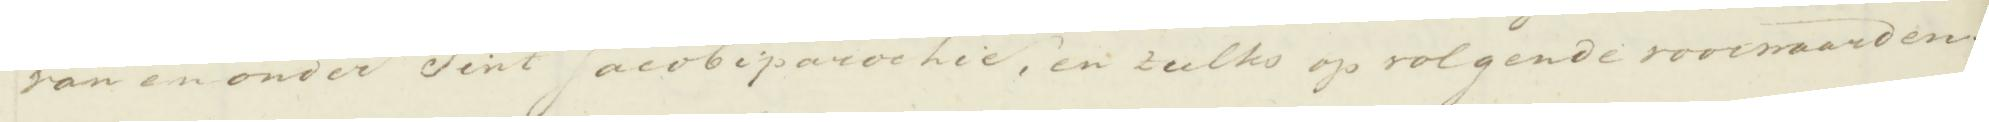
van en onder Sint Jacobiparochie, en zulks op volgende voorwaarden
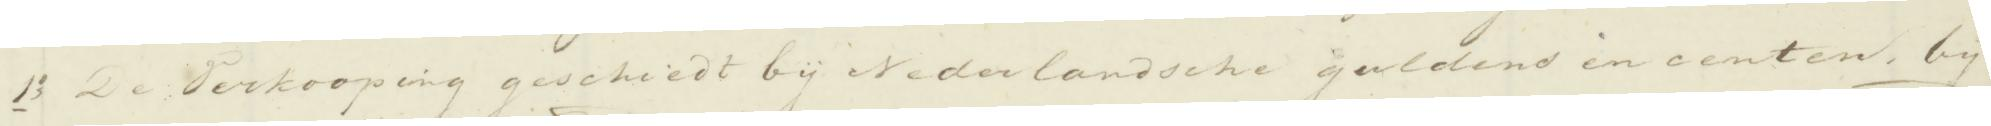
1=o De Verkooping geschiedt bij Nederlandsche guldens en centen, bij
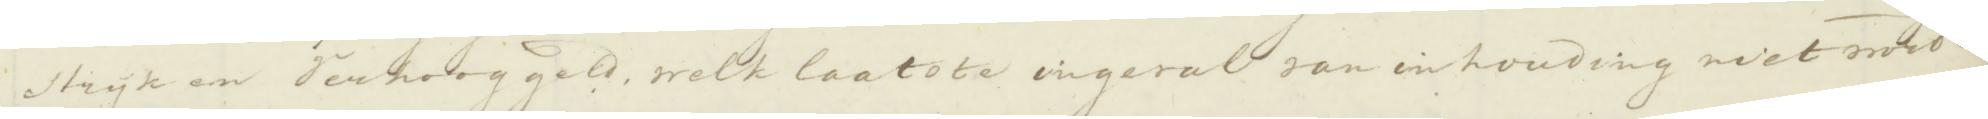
Strijk en Verhooggeld, welk laatste ingeval van inhouding niet wordt
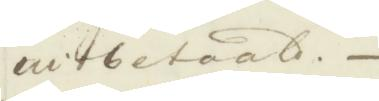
uitbetaald.
